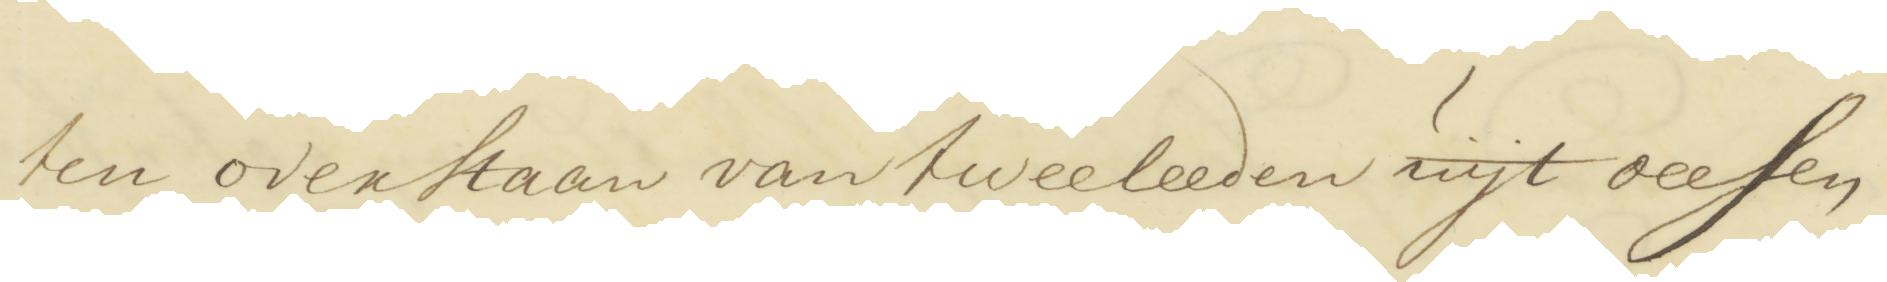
ten overstaan van tweeleeden uijt deesen
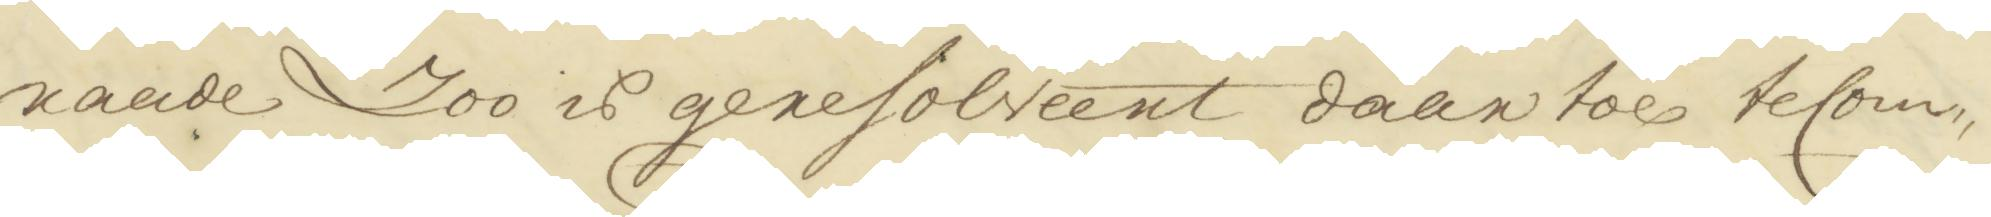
raade zoo is geresolveert daar toe te com„
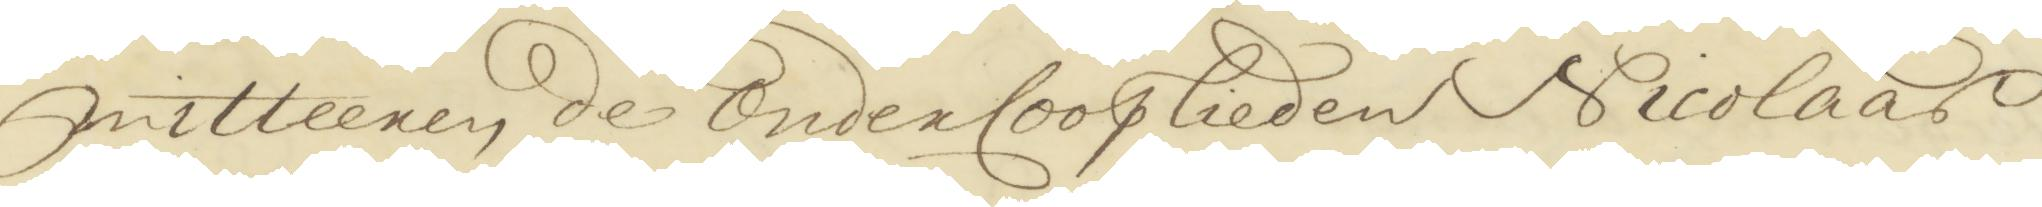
mitteeren de ondercooplieden Nicolaas
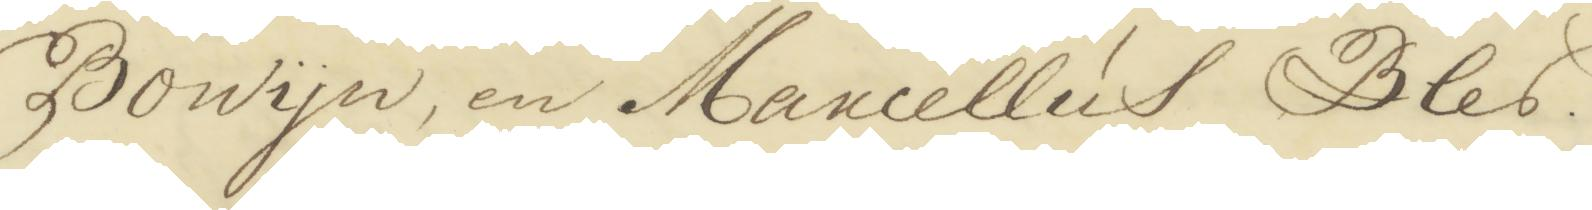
Bowijn, en Marcellus Bles.
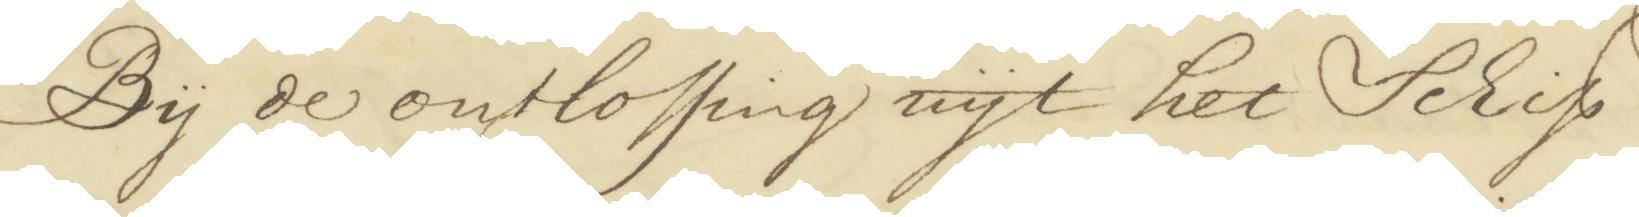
Bij de ontlossing uijt het schip
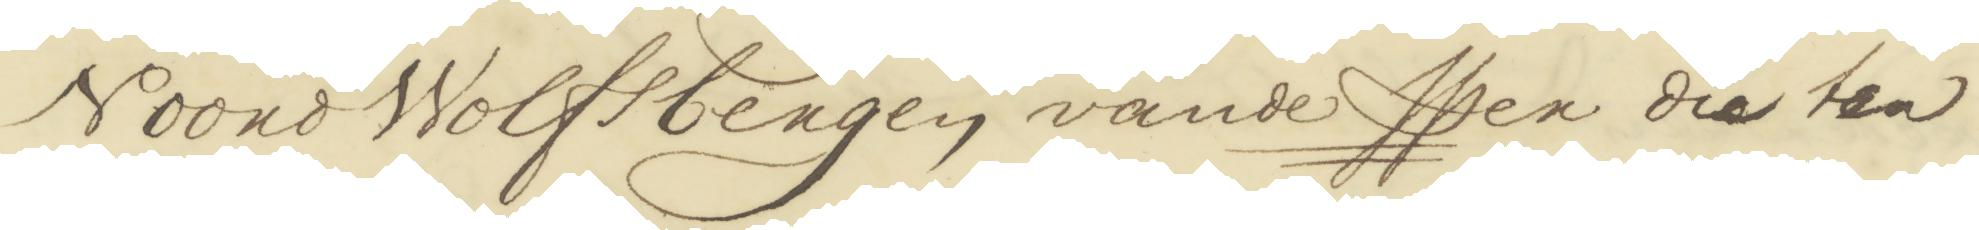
Noord Wolfsbergen vande pper die ten
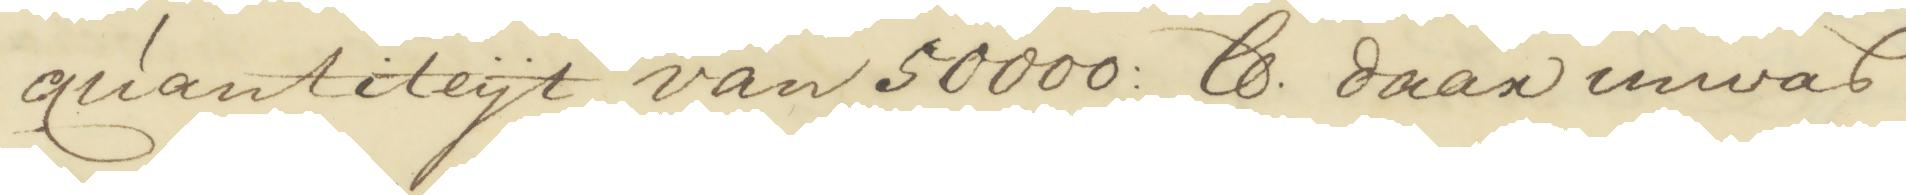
quantiteijt van 50'000: lb. daar inwas
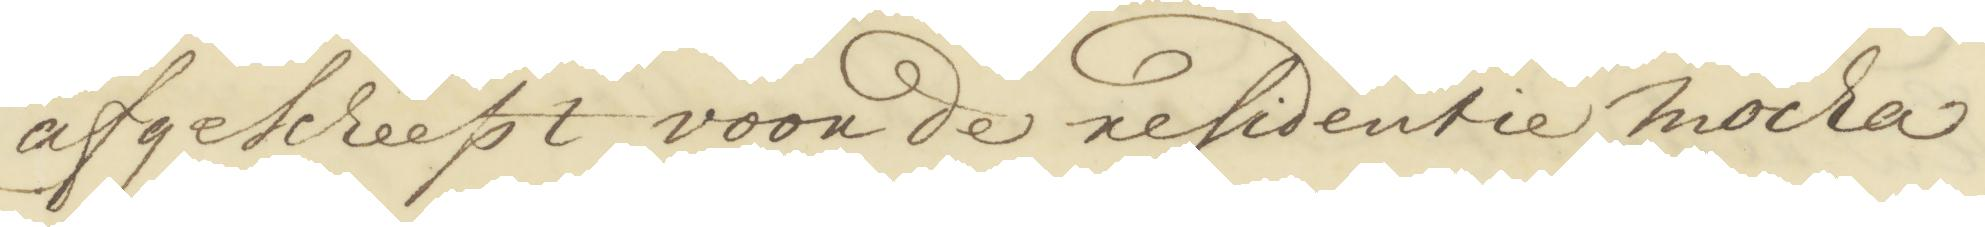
afgescheept voor de residentie mocha
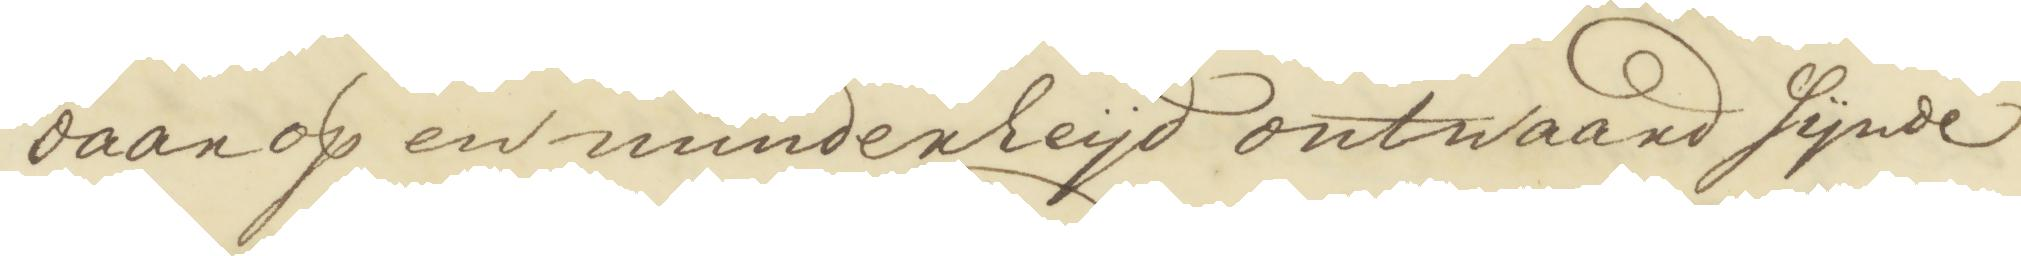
daar op en minderheijd ontwaard sijnde
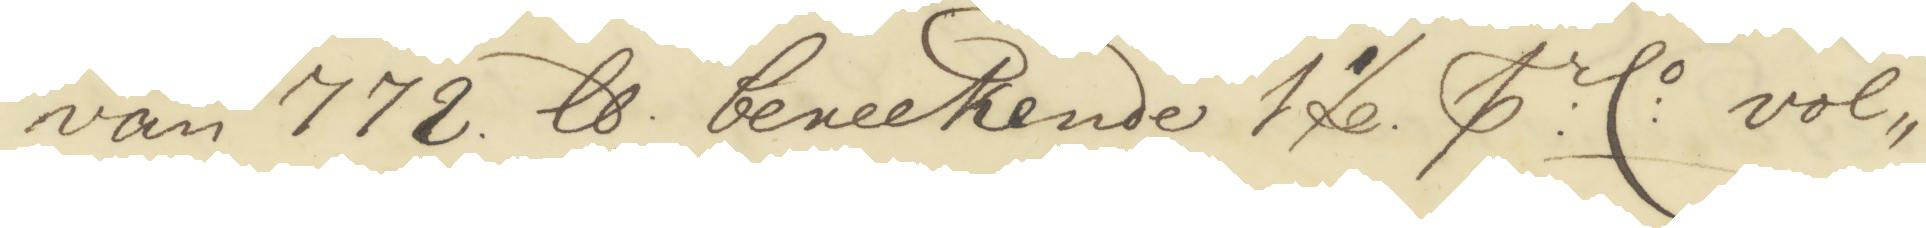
van 772. lb. bereekende 1½ p:r C:o vol„
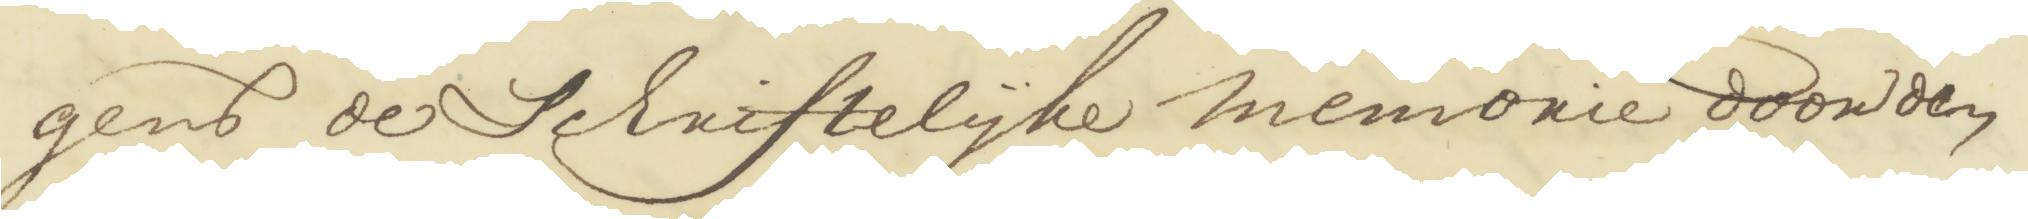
gens de schriftelijke memorie door den
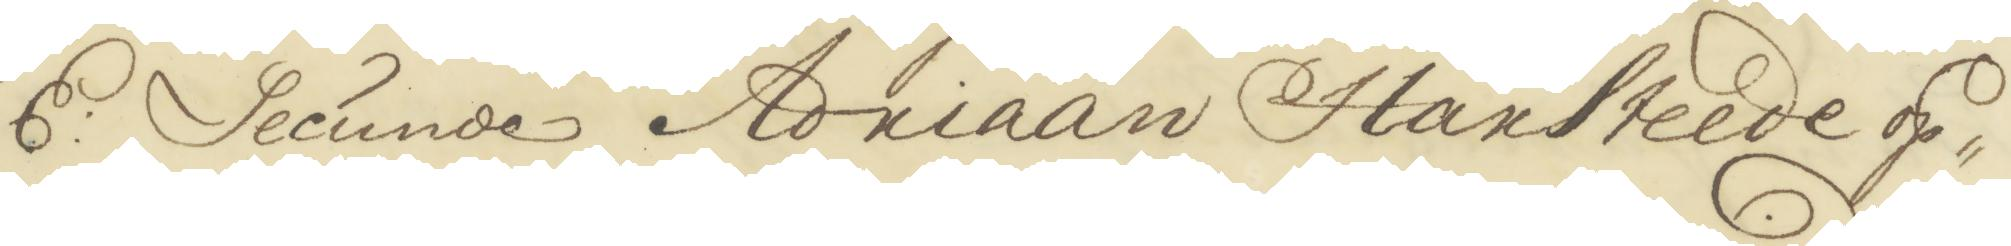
E: secunde Adriaan Harsteede op„
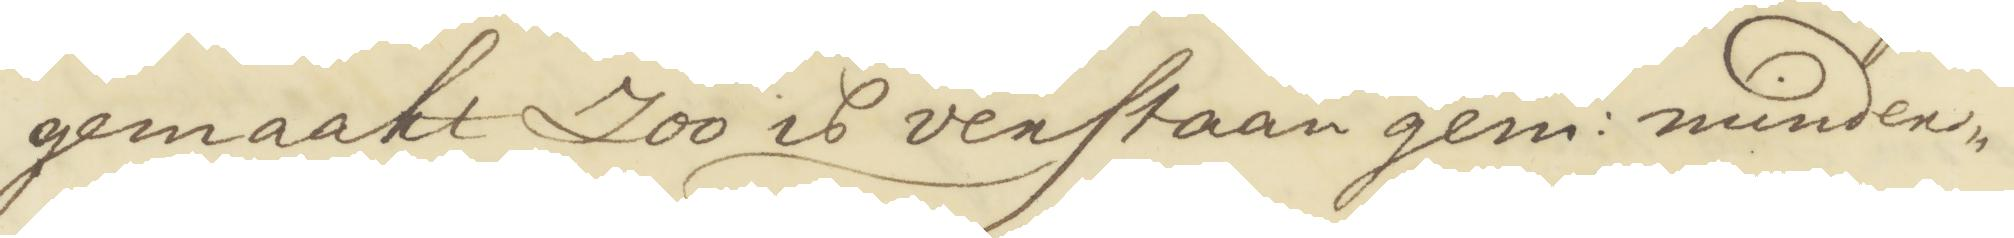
gemaakt zoo is verstaan gem: minder„
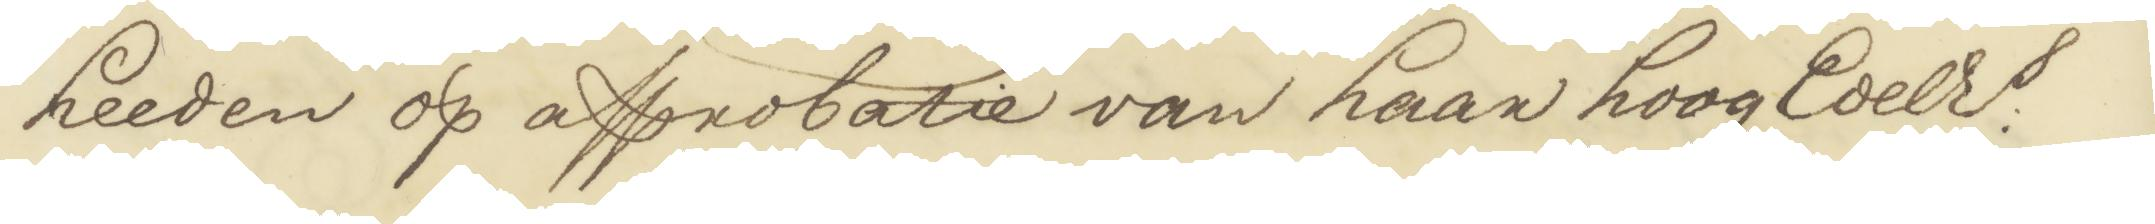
heeden op approbatie van haar hoog Edelh:s
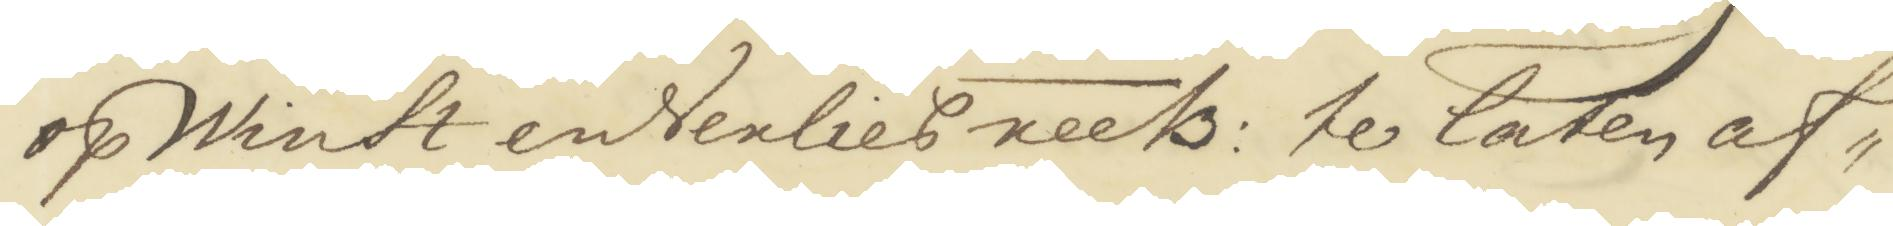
op winst en Verlies reek: te laten af„
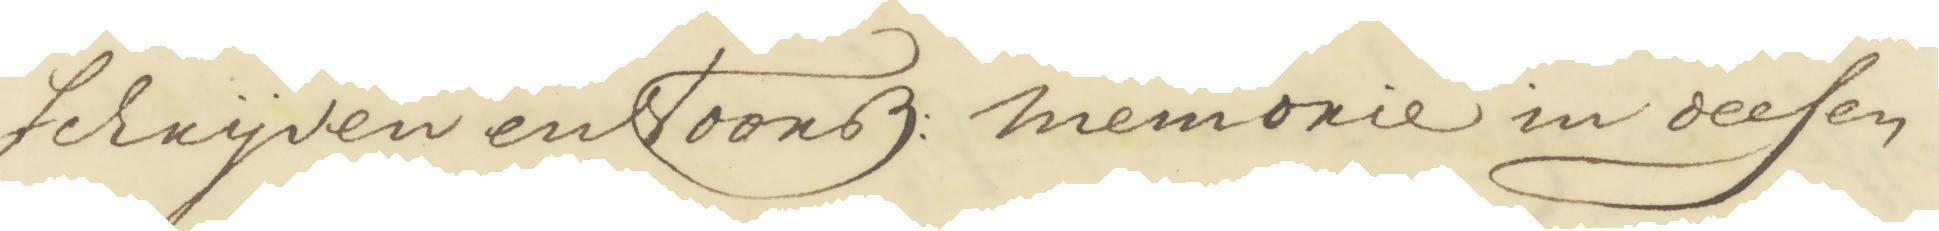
schrijven en voorsz: memorie in deesen
